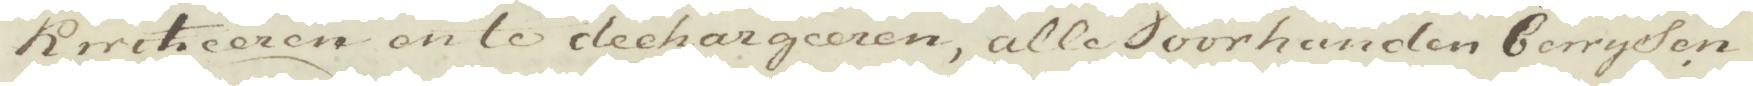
kwiteeren en te dechargeeren, alle voorhanden bewysen
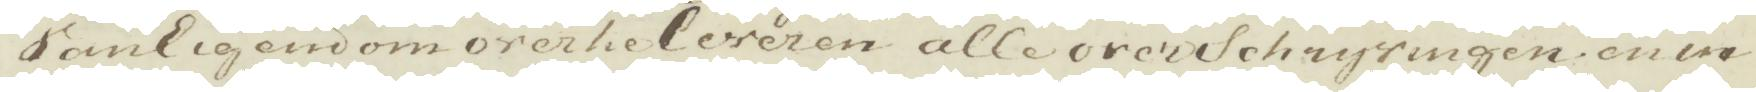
Van Eigendom over te leveren alle overschryvingen, en in
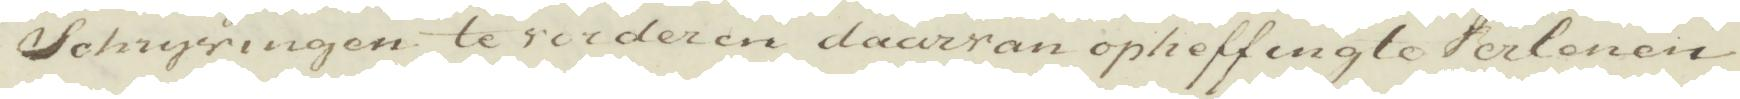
Schryvingen te vorderen daarvan opheffing te Verlenen
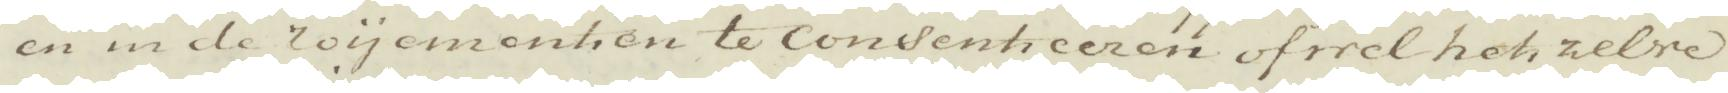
en in de roijementien te consentieeren of wel het zelve
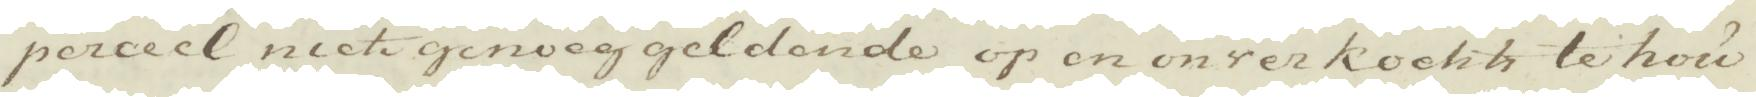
perceel niet genoeg geldende op en onverkocht te hou
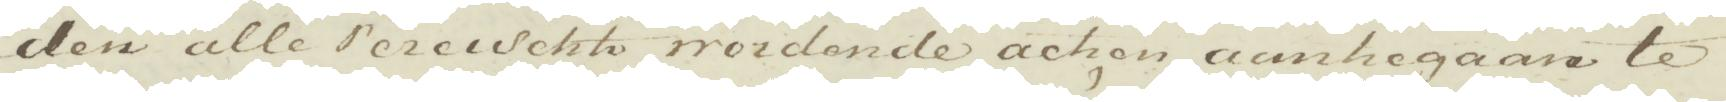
den alle vereischt wordende actien aan te gaan te
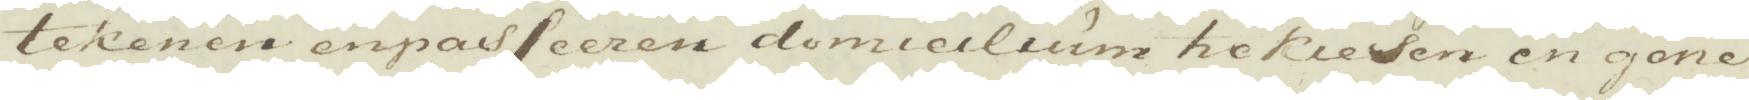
tekenen en passeeren domicilium te kiesen en gene
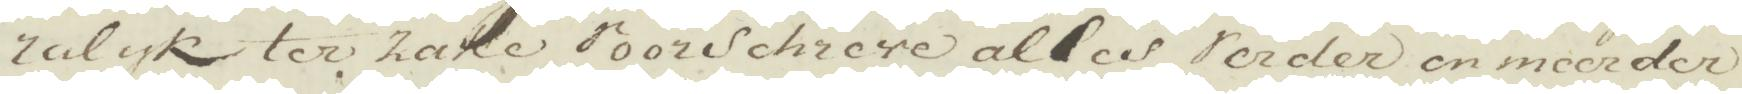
ralyk ter zake Voorschreve alles Verder en meerder
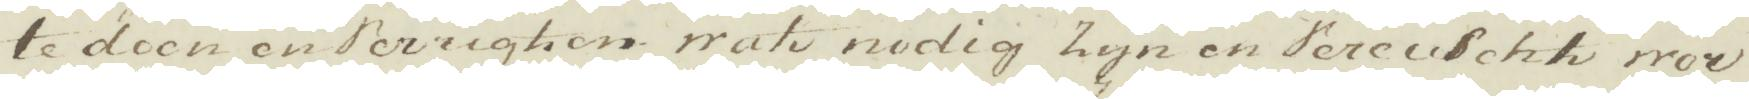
te doen en verrigten wat nodig zyn en Vereischt wor
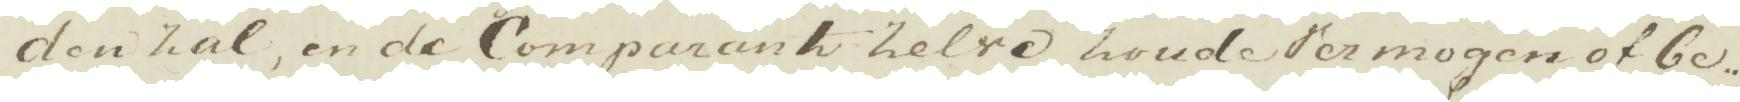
den Zal, en de Comparant zelve houde Vermogen of be„
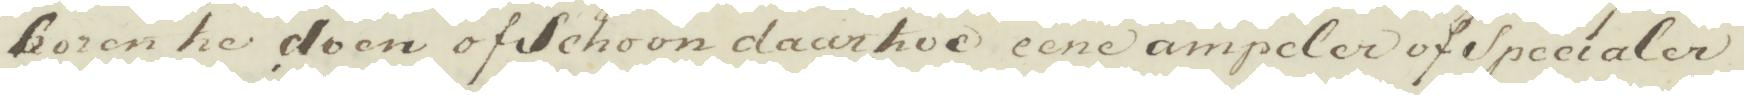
horen te doen of Schoon daartoe eene ampeler of Specialer
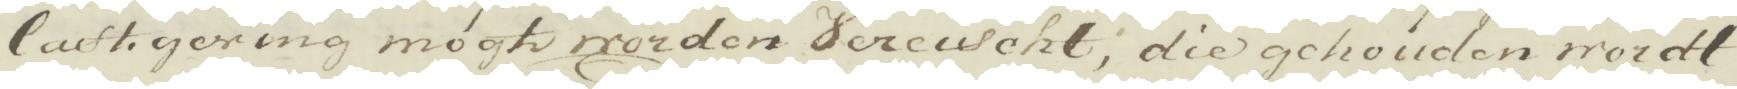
lastgeving mogt werden Vereischt, die gehouden wordt
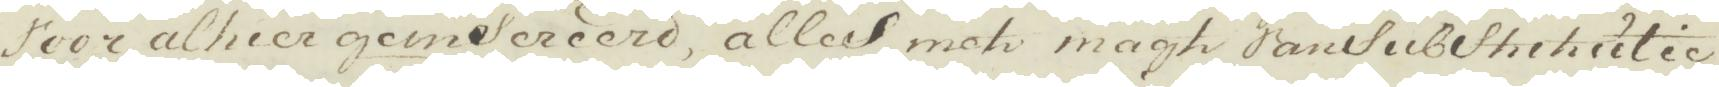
Voor alhier geinsereerd, alles met magt van substitutie
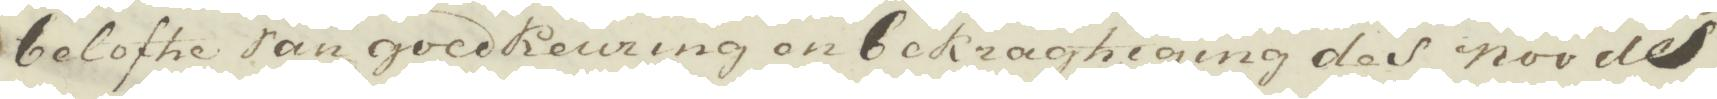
belofte van goedkeuring en bekragtiging des noods
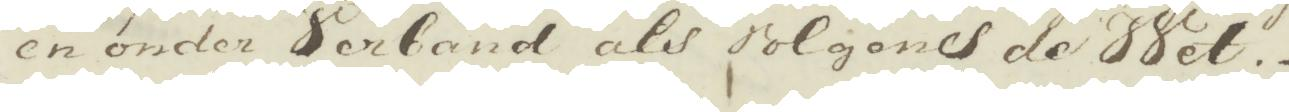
en onder Verband als volgens de Wet.
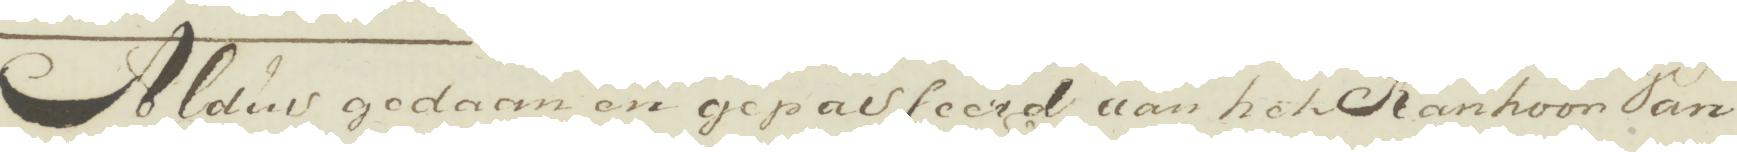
Aldus gedaan en gepasseerd aan het Kantoor Van
